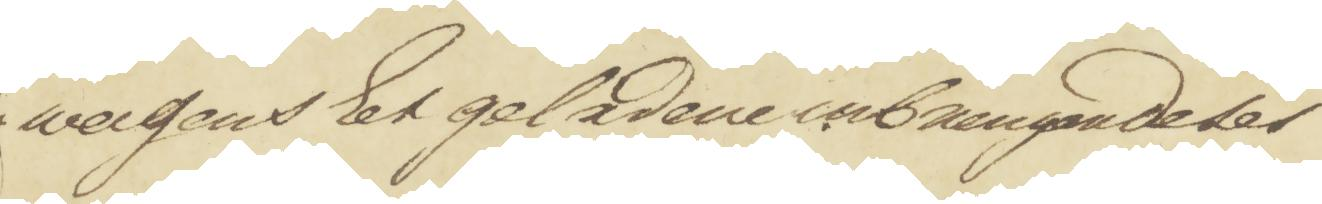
wagens het geladene en brenger deses
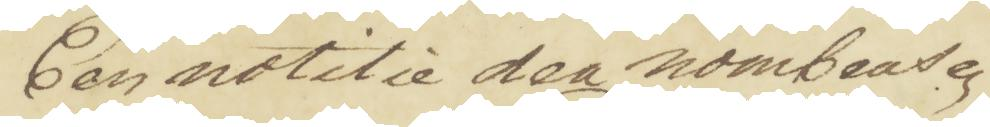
Een notitie der nombers en
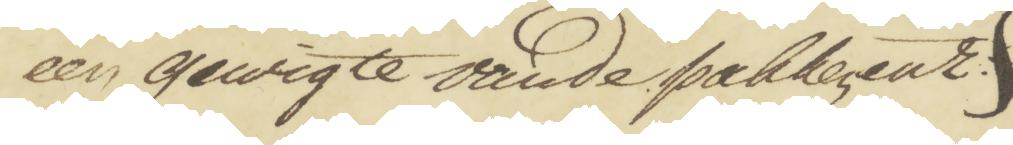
een gewigte vande pakken enz:
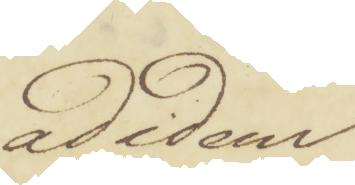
ad idem
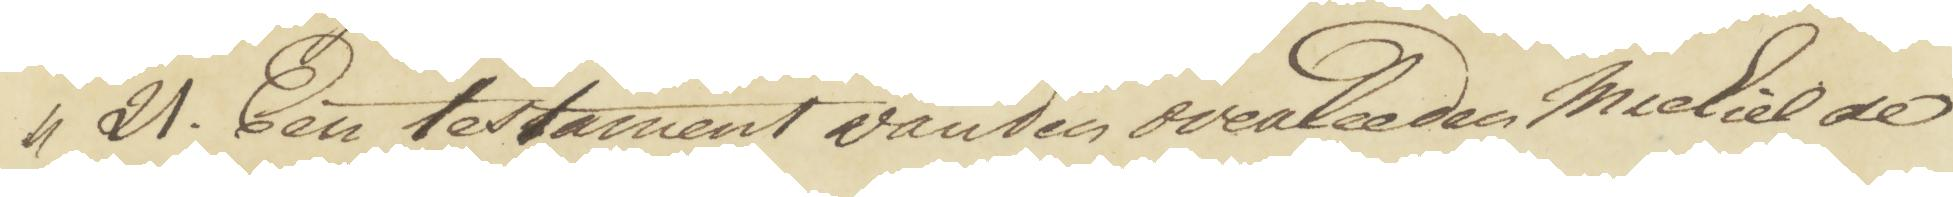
„ 21. Een testament van den overleeden Michiel de
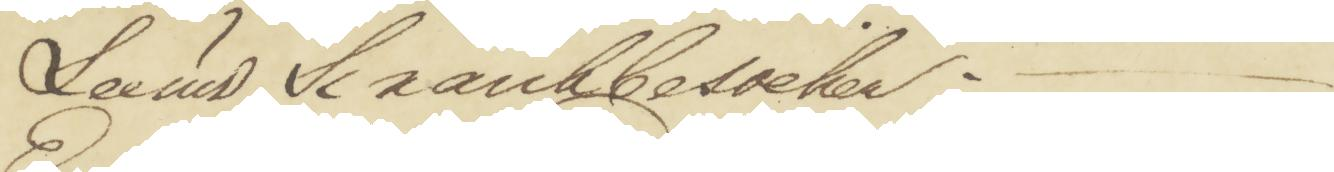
leeuw krankbesoeker. —
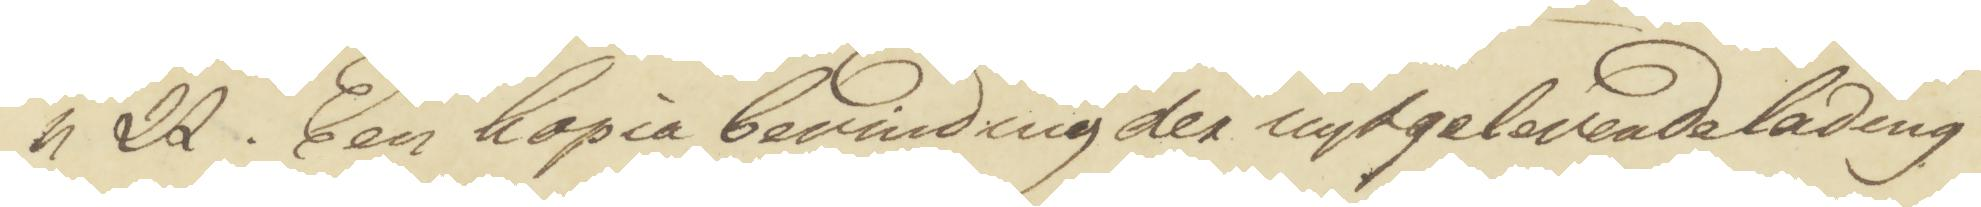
„ 22. Een kopia bevinding der uytgeleverde lading
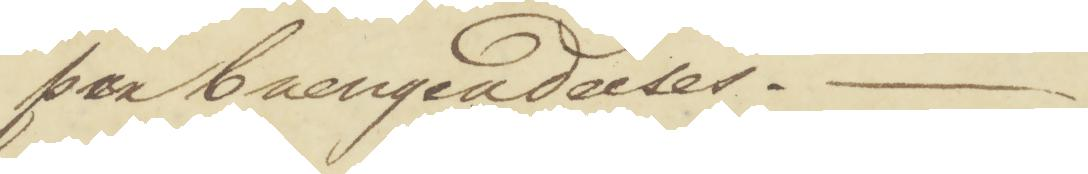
per brenger deeses. —
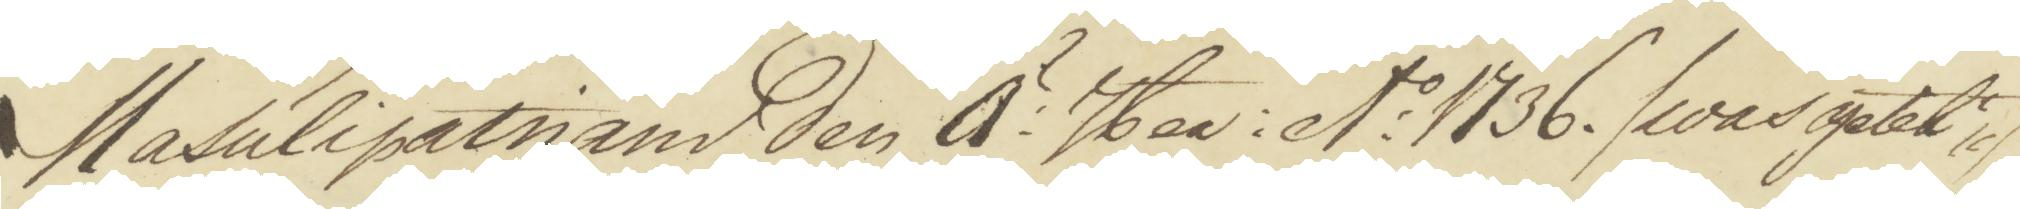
Masulipatnam den 4:' 7ber: A:o 1736. /was getek„t
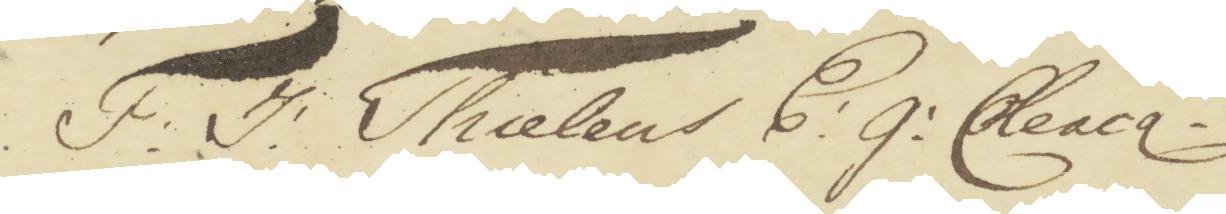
F: J: Thielens E: g: Clercq -
